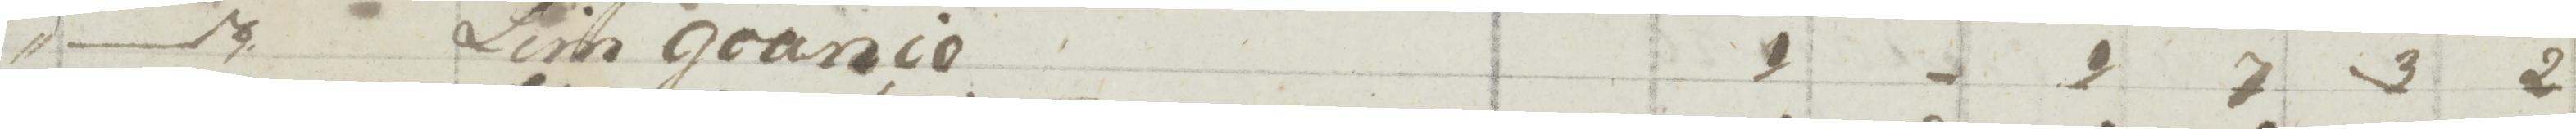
„ _„o Lim goanio 1 – 1 7 3 2
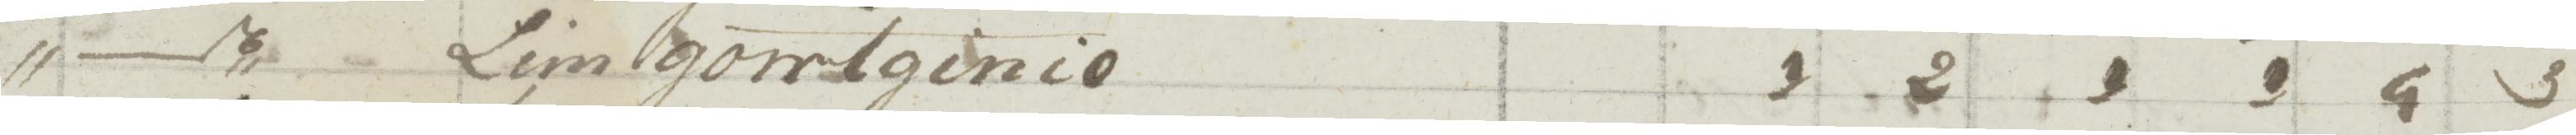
„ _„o Lim gowtginio 3 2 1 1 4 3
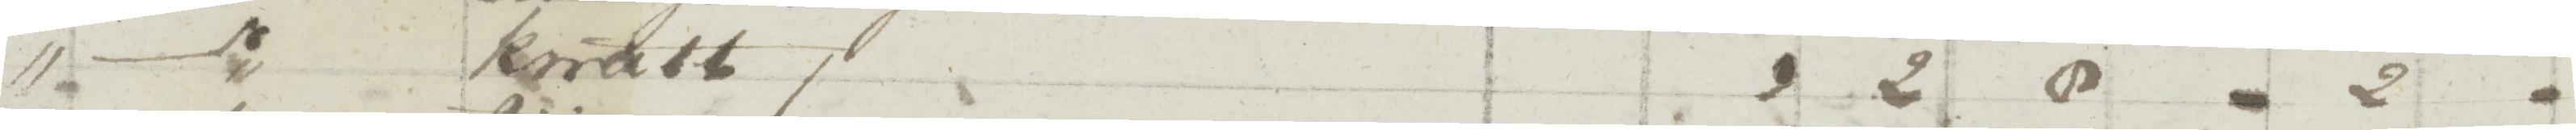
„ _„o kwatt 1 2 8 – 2 –
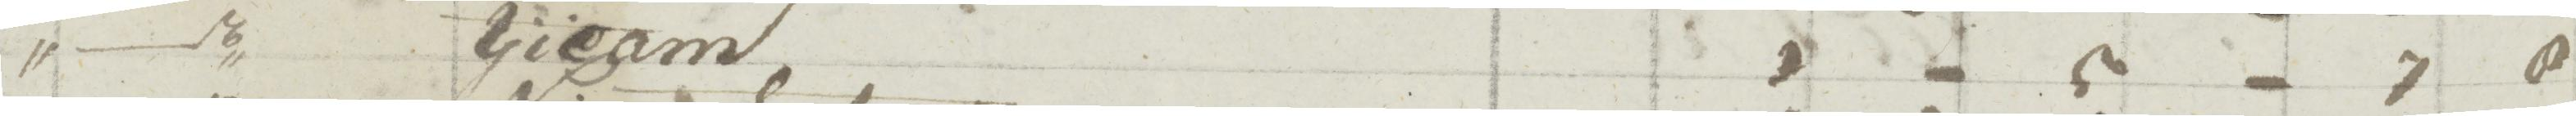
„ _„o tjicam 1 – 5 – 7 8
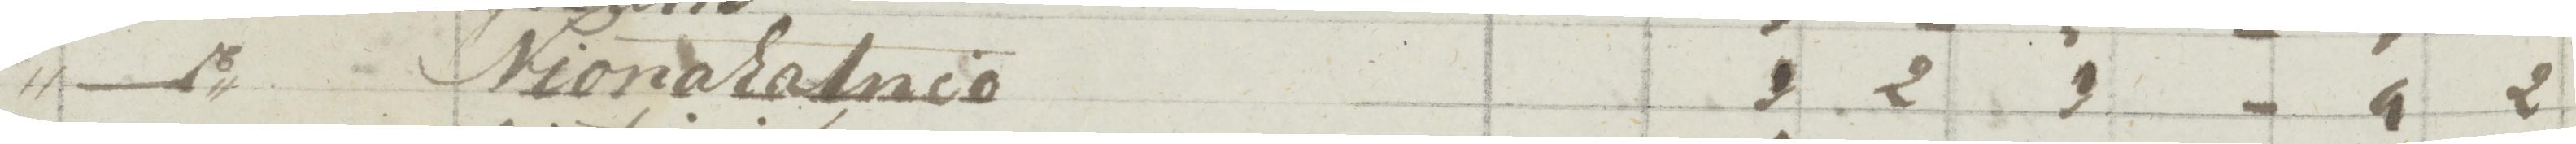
„ _„o Nionahatnio 1 2 1 – 4 2
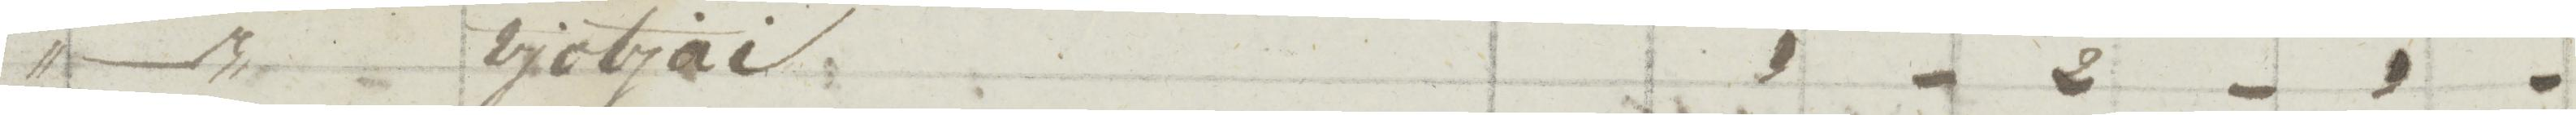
„ _„o tjotjai 1 – 2 – 1 –
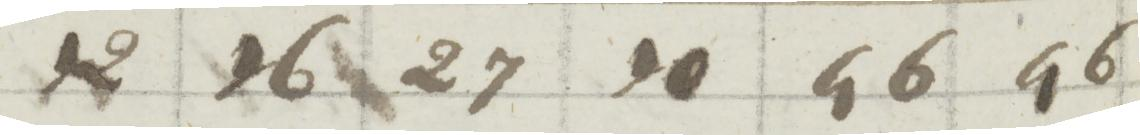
12 16 27 10 46 46
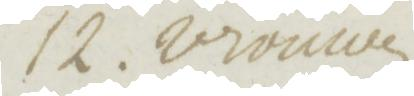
12. vrouwen
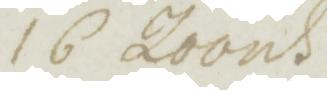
16 zoons
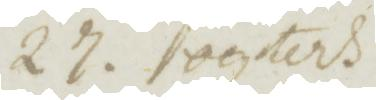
27. dogters
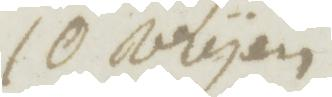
10 vrijen
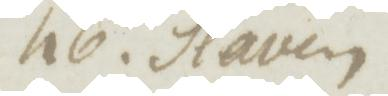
46. slaven
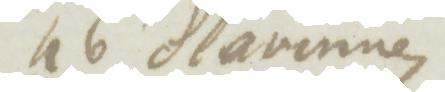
46 slavinnen
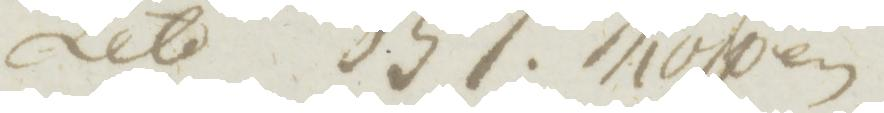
Teld 157. koppen
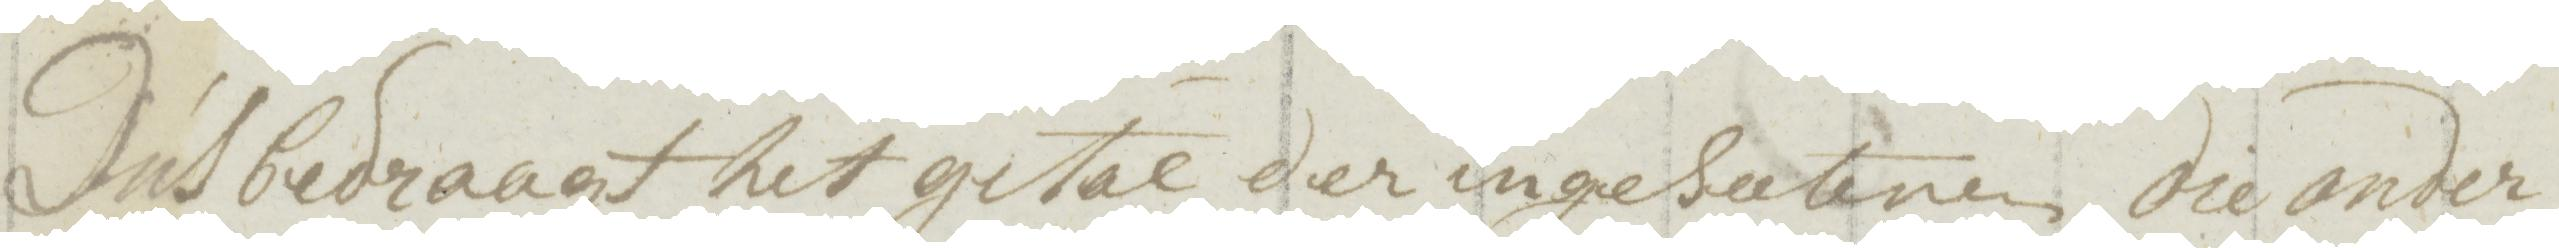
Dus bedraagt het getal der ingeseetenen, die onder
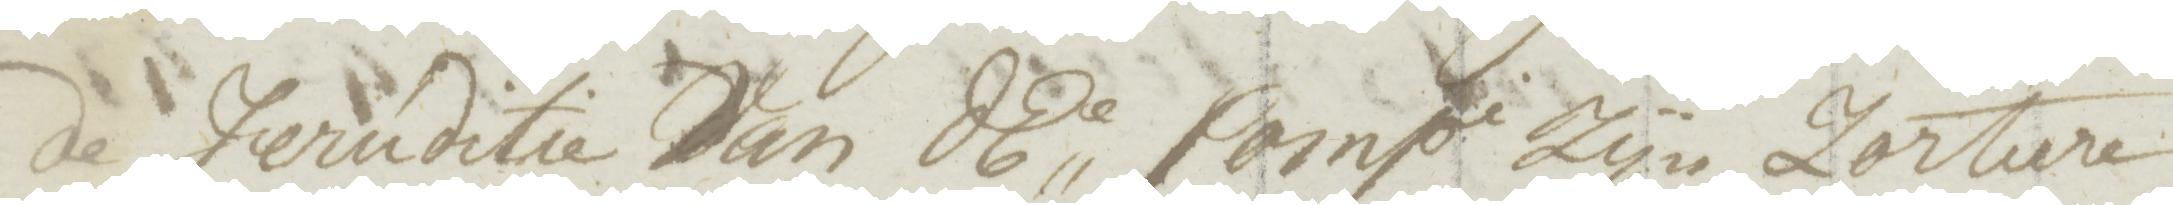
de Jeruditie van dE„e Comp:s zijn zortiere
